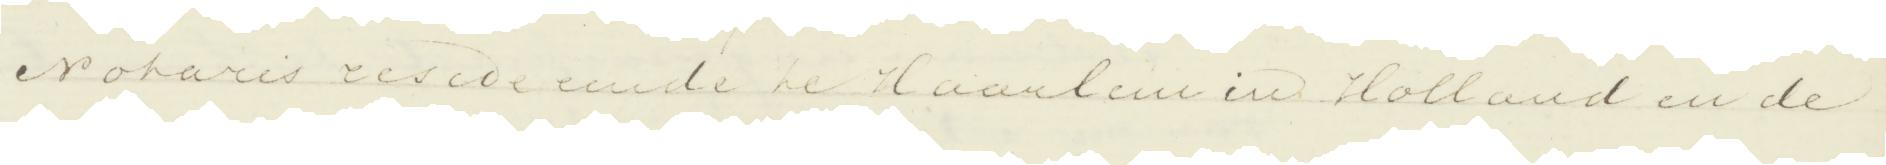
Notaris residereende te Haarlem in Holland en de
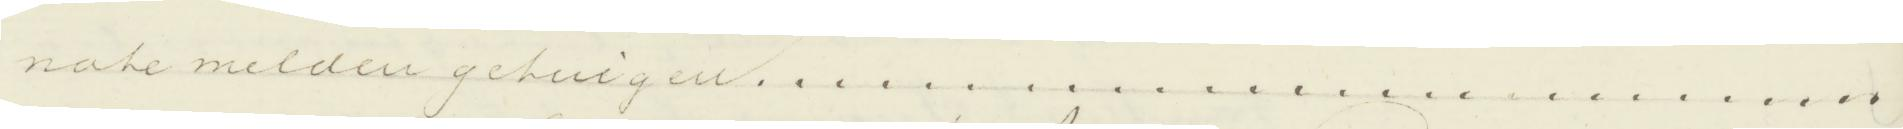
nate melden getuigen . . . . . . . . . . . . . . . . . . . . . . . . . . .
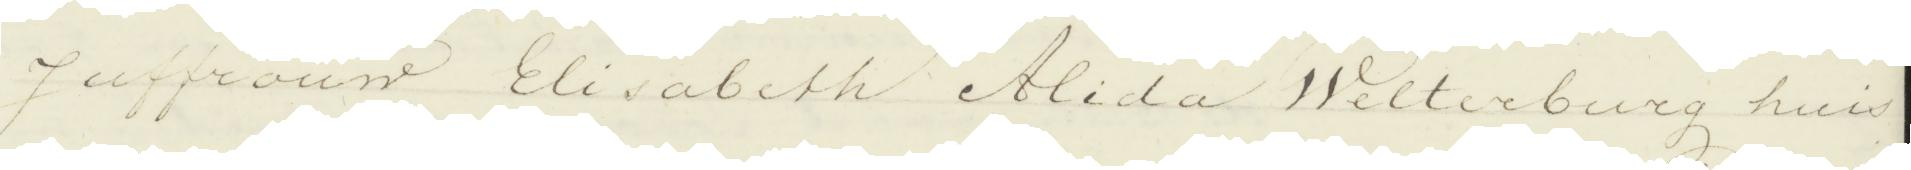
Juffrouw Elisabeth Alida Welterburg huis
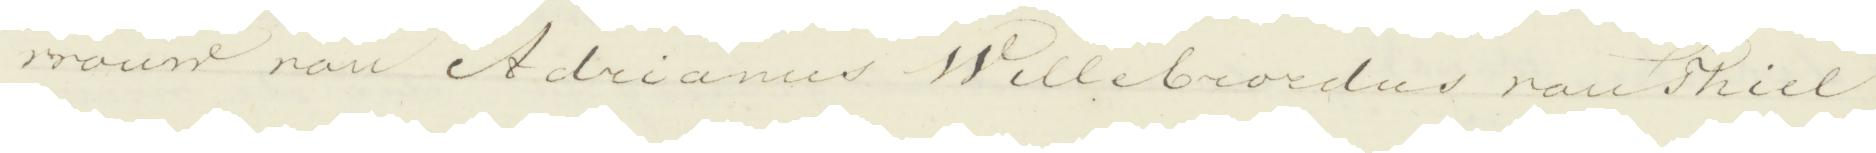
vrouw van Adrianus Willebrordus van Thiel
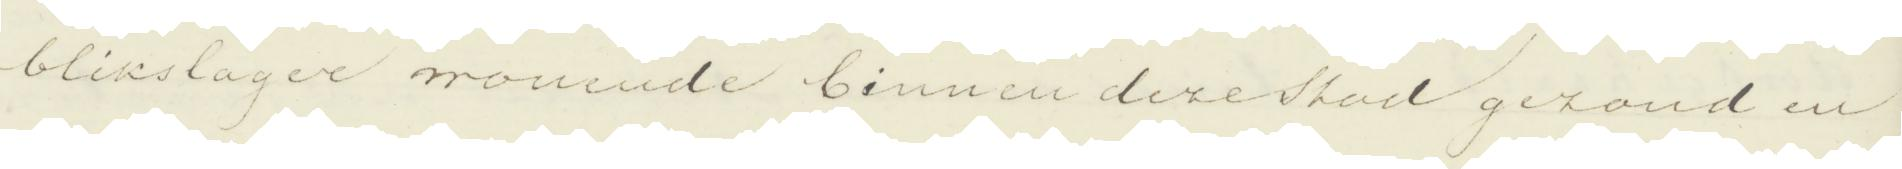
blikslager wonende binnen deze stad gezond en
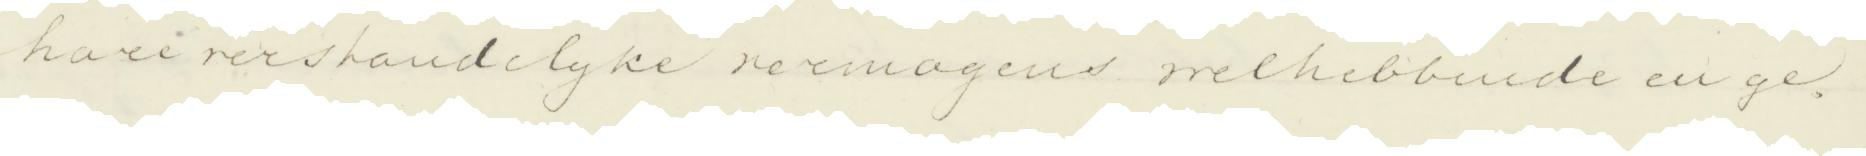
hare verstandelyke vermogens welhebbende en ge„
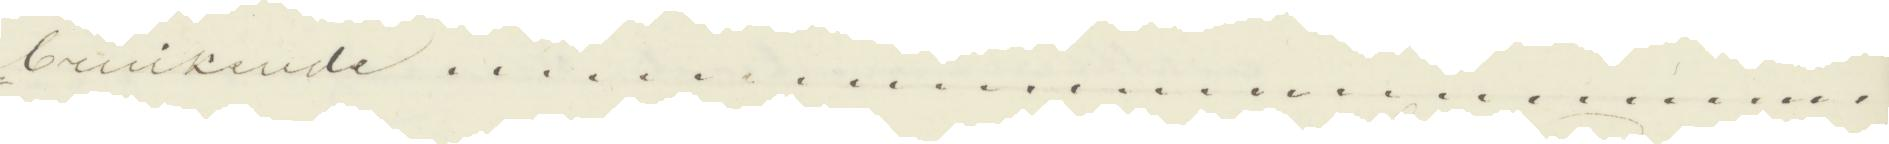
bruikende . . . . . . . . . . . . . . . . . . . . . . . . . . . . . . . .
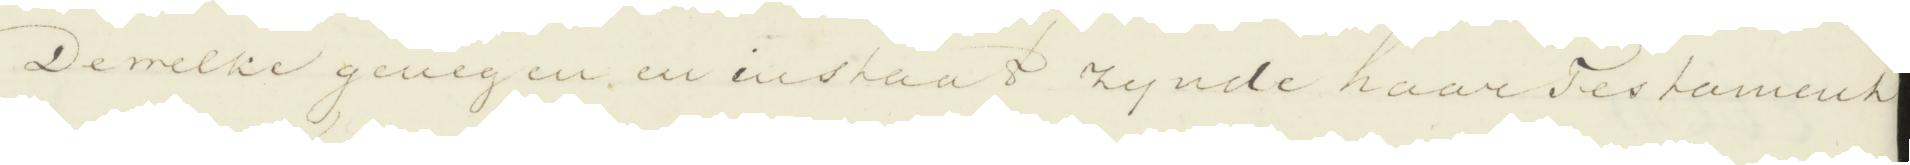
Dewelke genegen en instaat zynde haar Testament
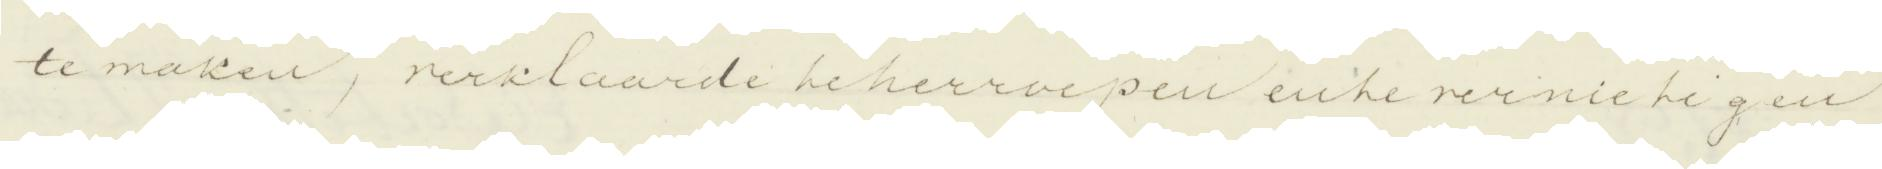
te maken, verklaarde te herroepen en te vernietigen
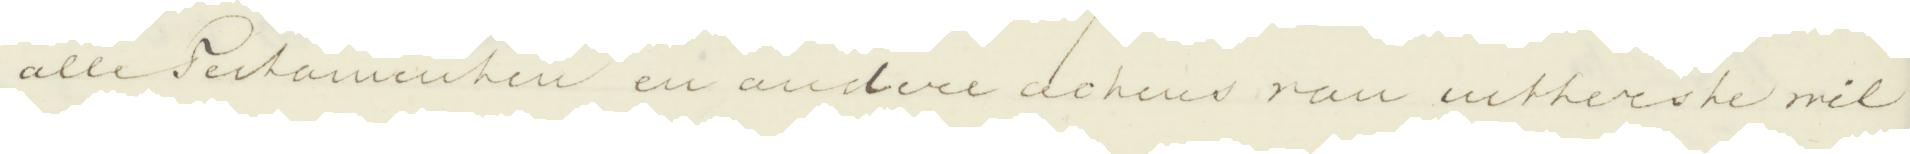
alle Testamenten en andere actens van uitterste wil
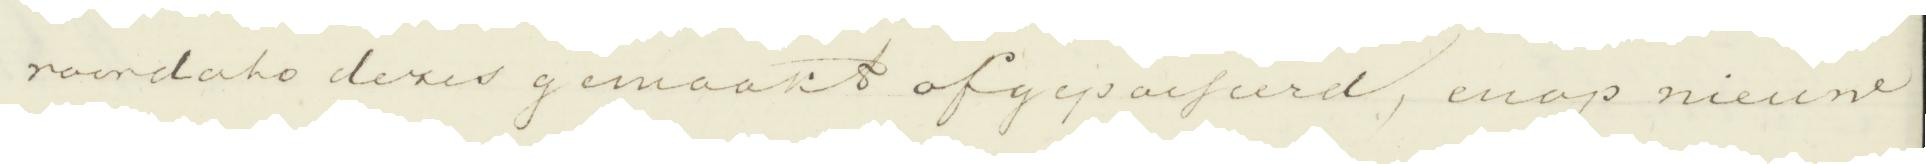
voordato dezes gemaakt of gepasseerd, en op nieuw
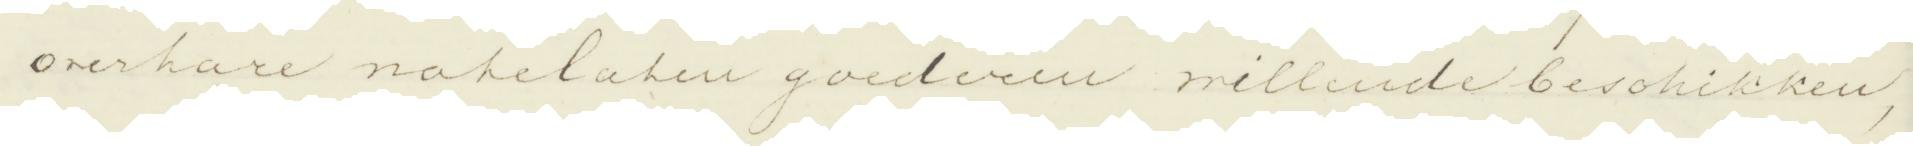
overhare natelaten goederen willende beschikken,
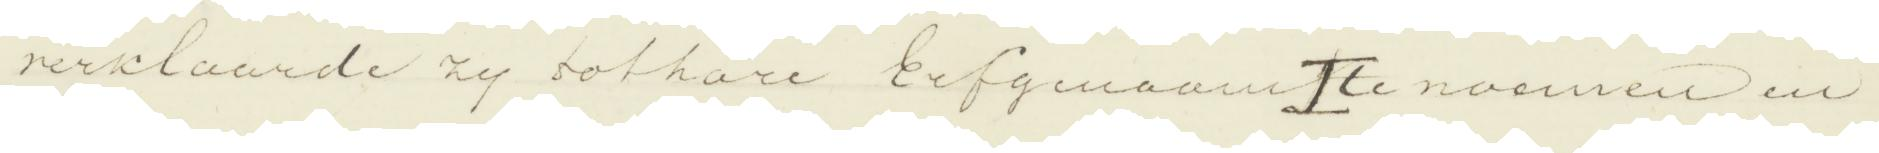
verklaarde zy tot hare Erfgenaam¶ te noemen en
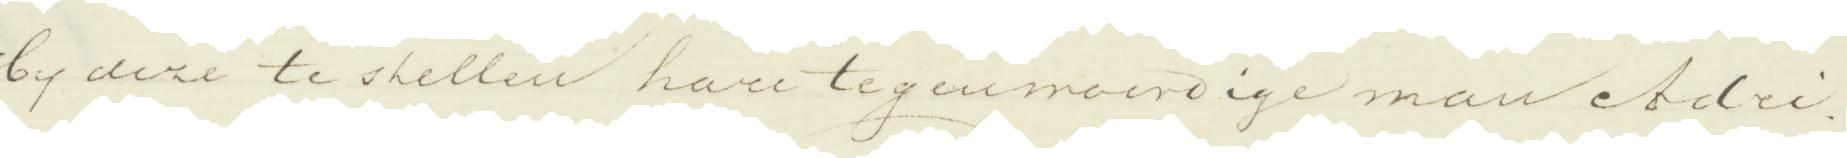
by deze te stellen hare tegenwoordige man Adri
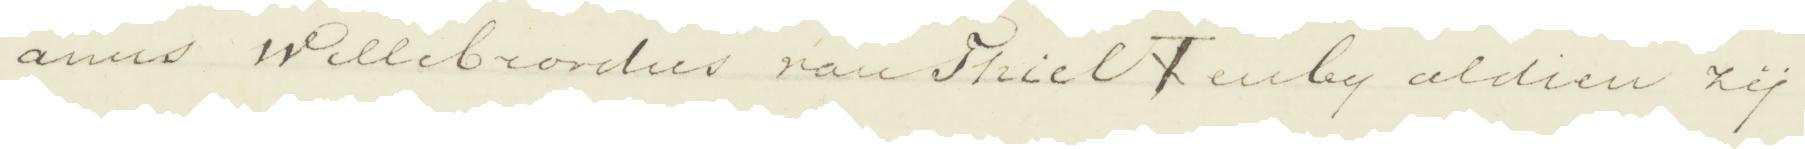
anus Willebrordus van Thiel ¶ en by aldien zy
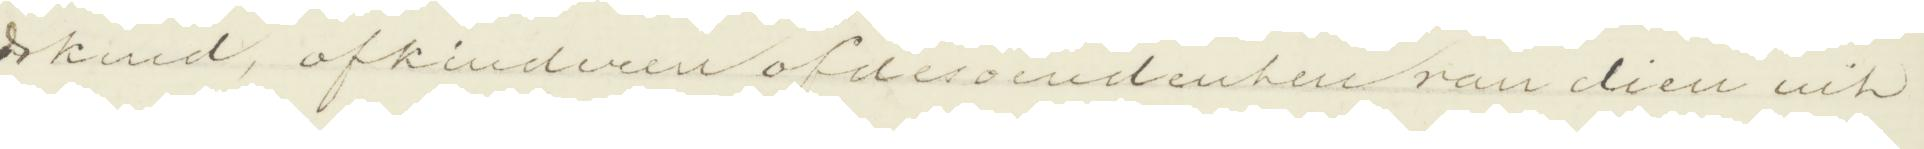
kind, of kinderen of descendenten van dien uit
